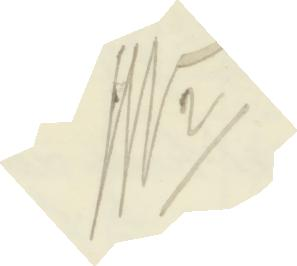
We
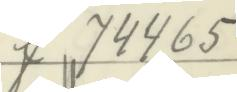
ƒ 74465
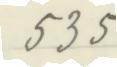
535
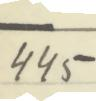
445
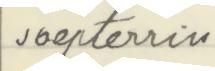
soepterrin
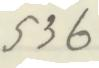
536
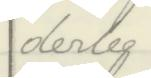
derleg
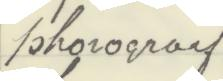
phonograaf
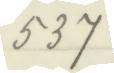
537
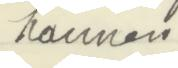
kannen
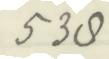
538
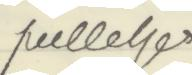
pulletjes
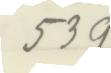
539
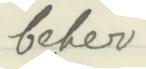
beker
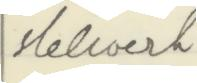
stelwerk
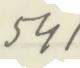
541
